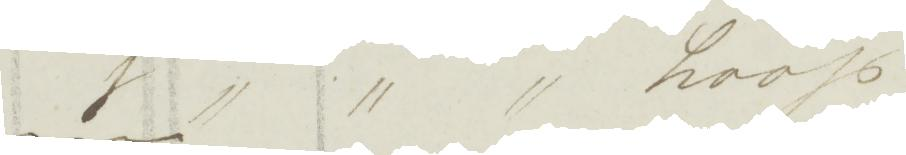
1 „ „ „ hoop
